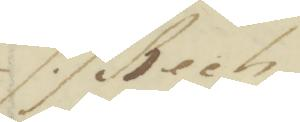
J. J Bech
